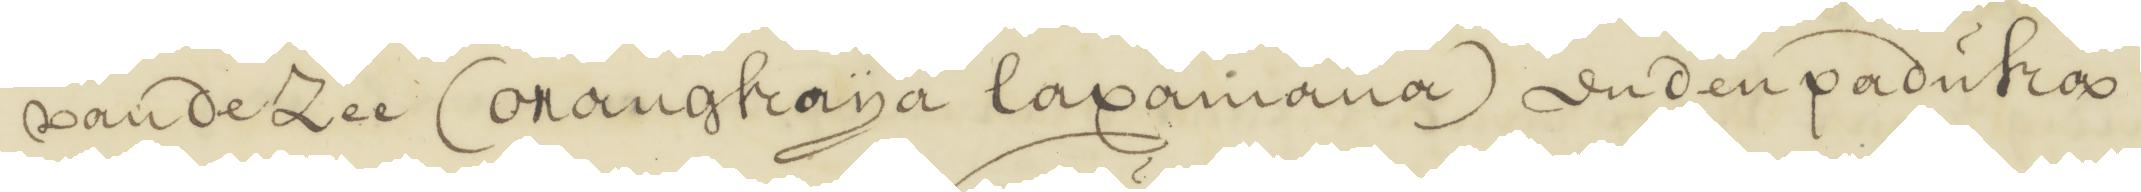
van de zee (orangkaija laxamana) en den paduka
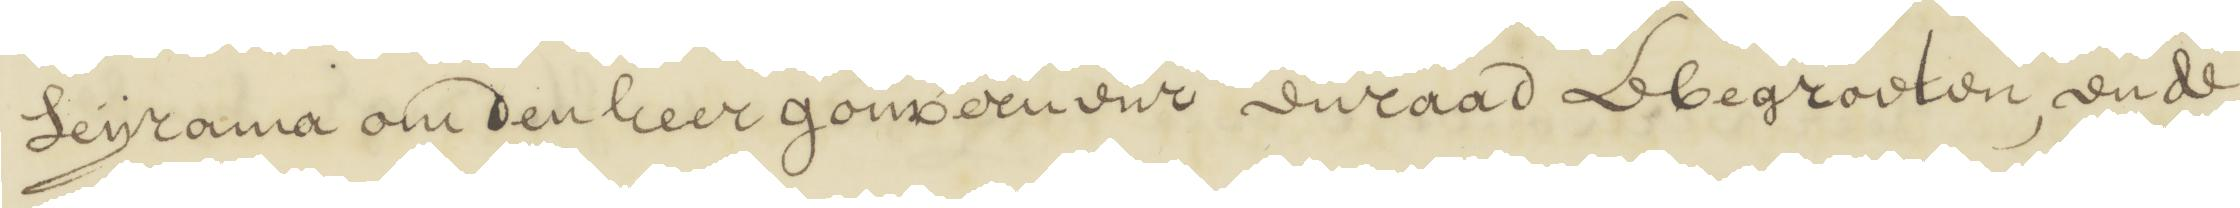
Seijrama om den heer gouverneur en raad te begroeten, en de
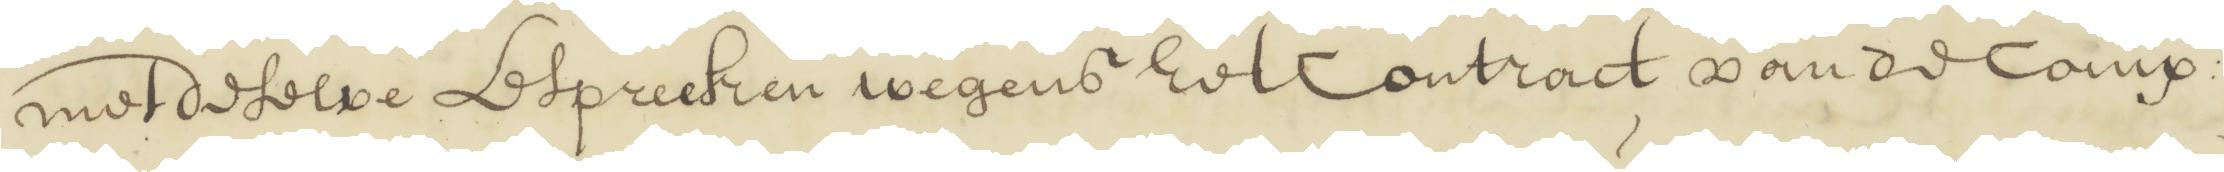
met deselve te spreeken wegens het Contract van de Comp:
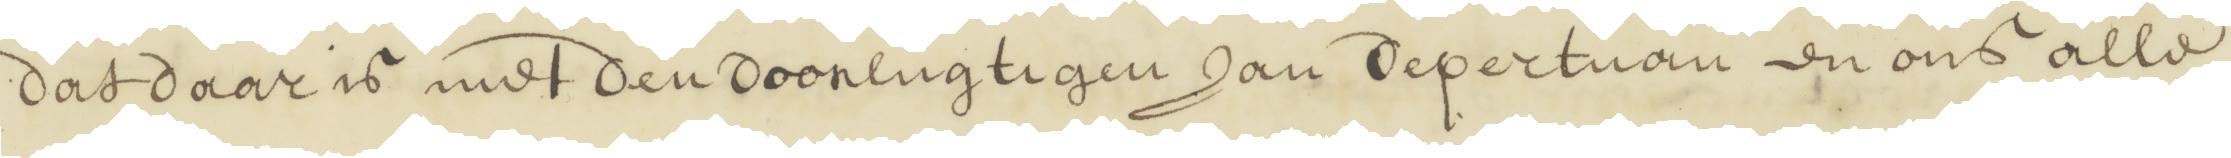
dat daar is met den doorlugtigen Jan depertuan en ons alle
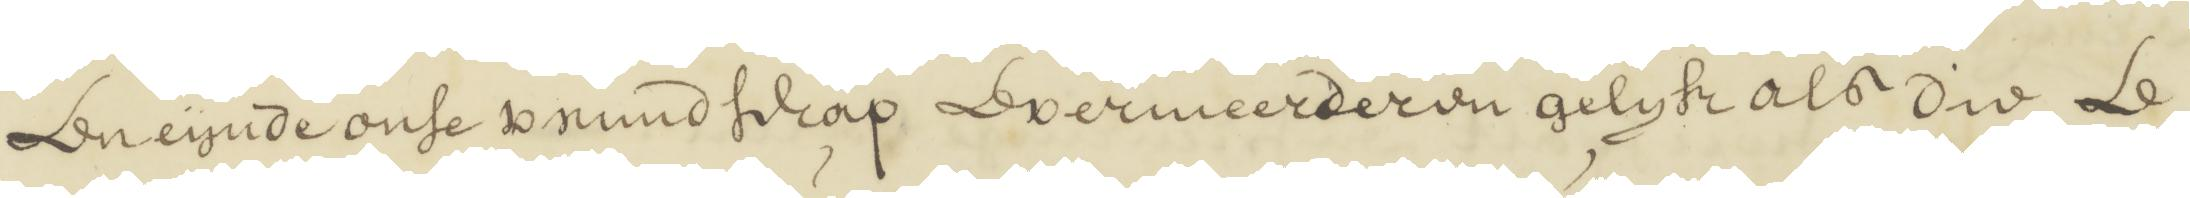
ten eijnde onse vrundschap tevermeerderen gelyk als die te
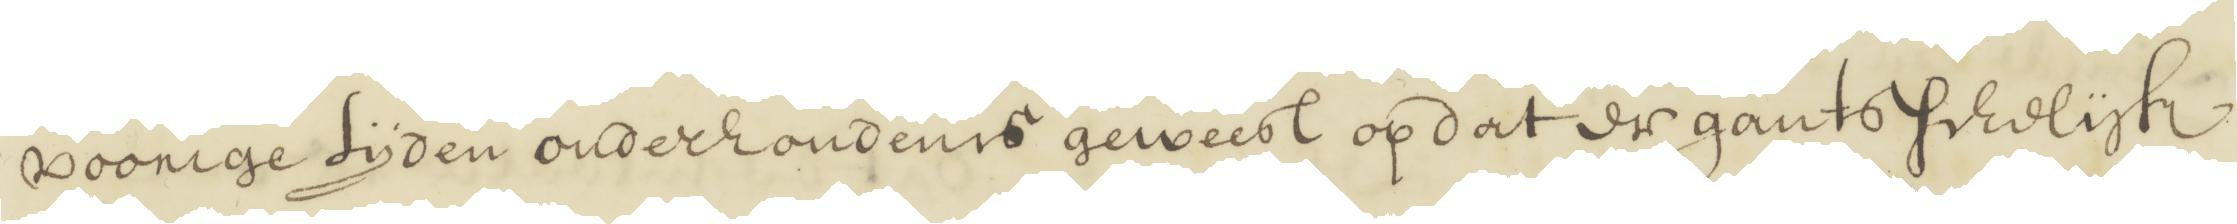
voorige tijden onderhoudenis geweest op dat 'er gantsschelijk
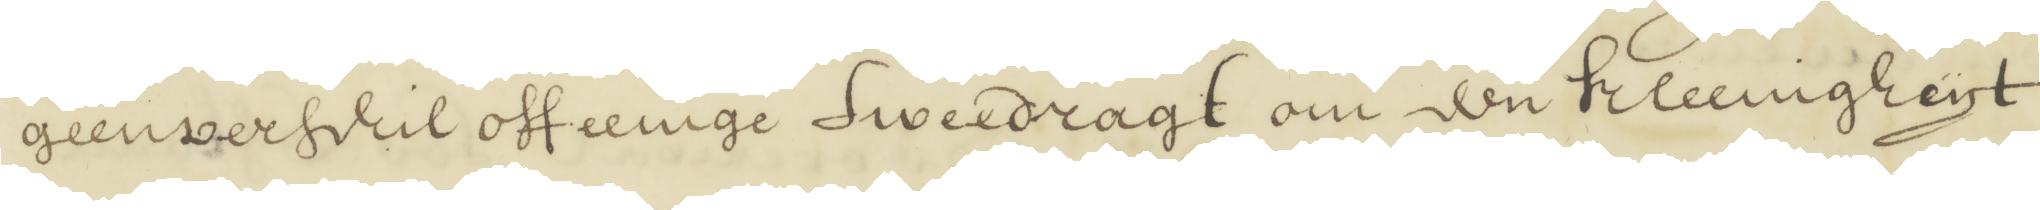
geenverschil off eenige tweedragt om een kleenigheijt
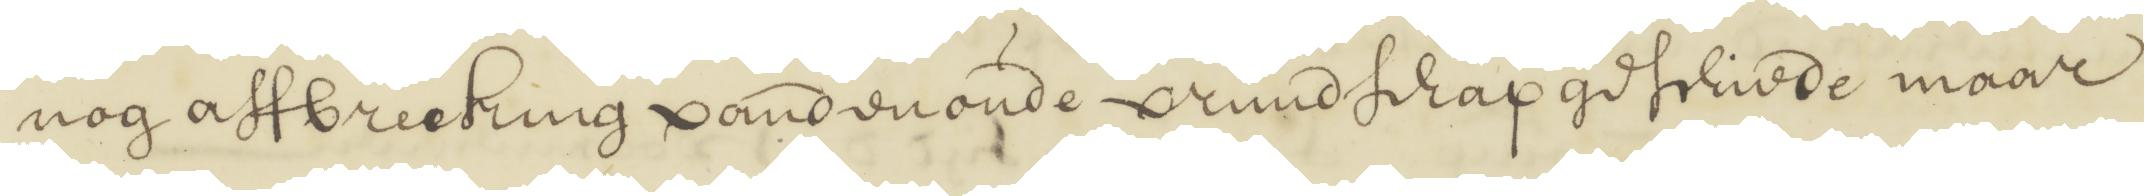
nog affbrecking vanden oude vrundschap geschiede maar
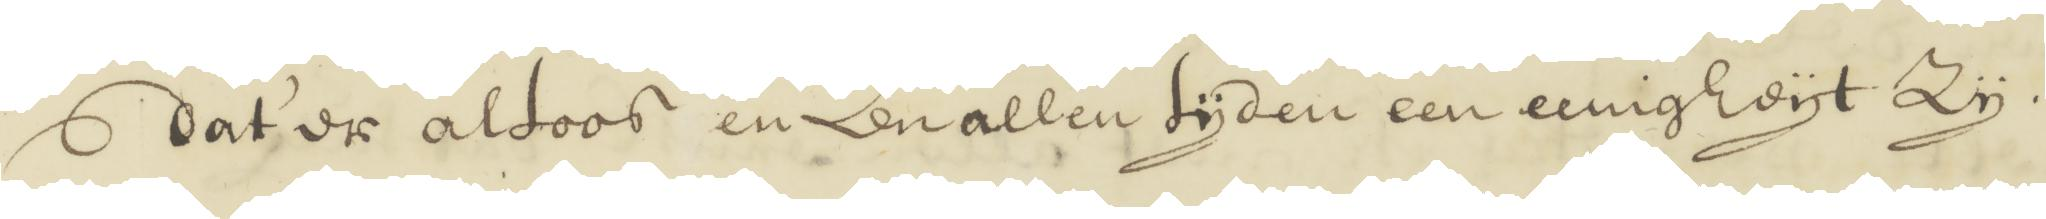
dat 'er altoos en ten allen tijden een eenigheijt Zij.
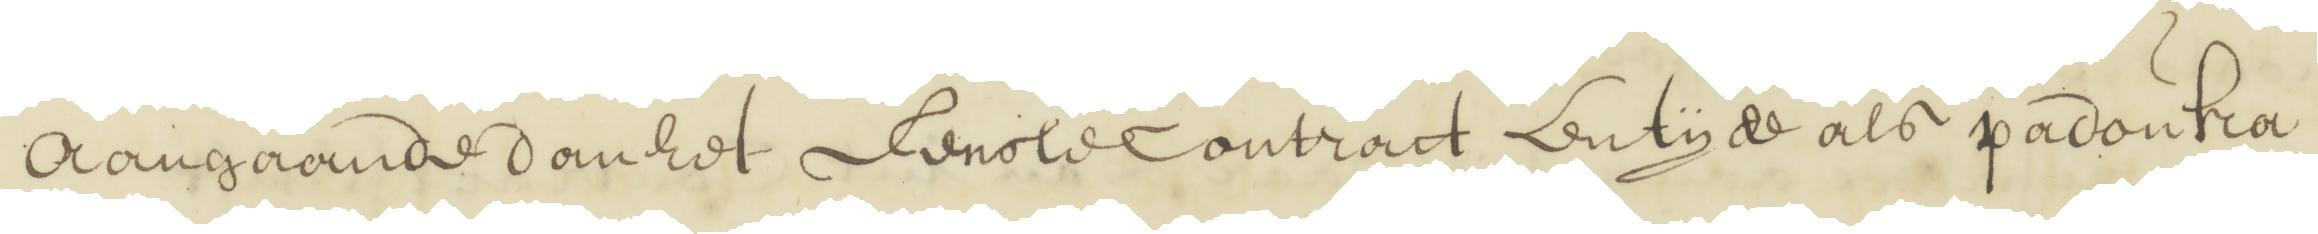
Aangaande dan het Eerste Contract ten tijde als padouka
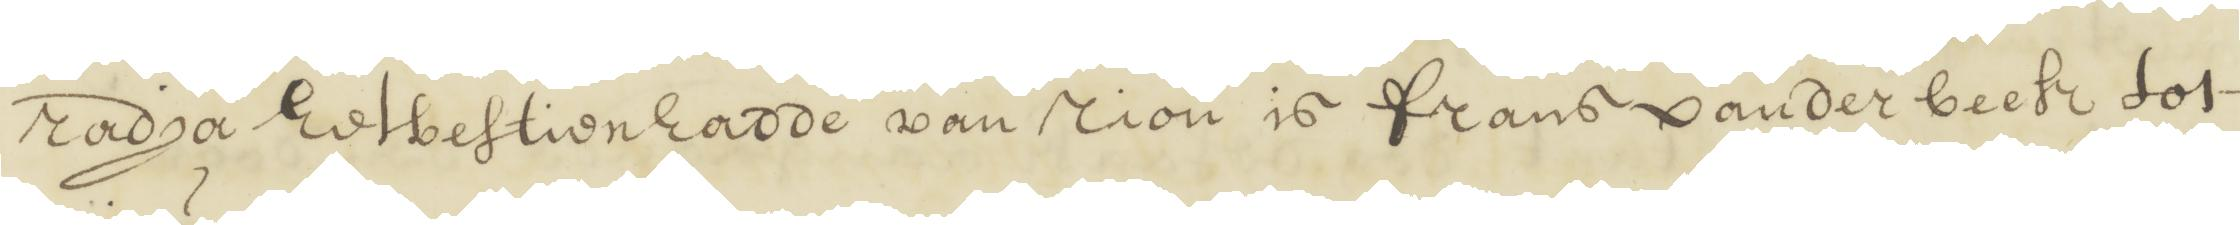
radja het bestier hadde van riou is frans van der beek tot
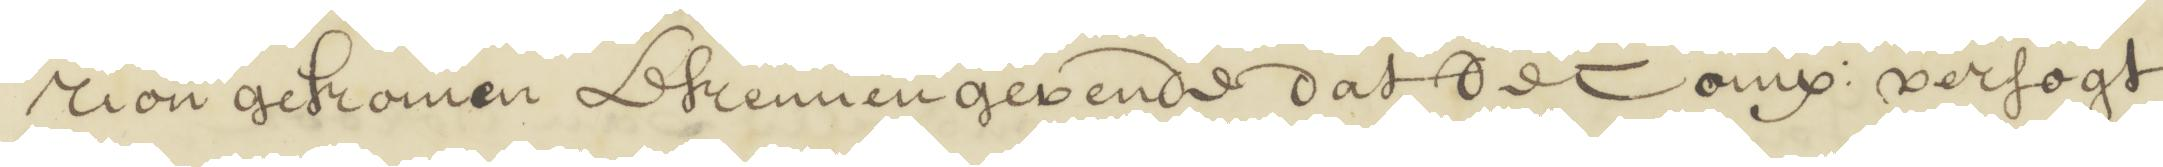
riou gekomen tekennen gevende dat de Comp: versogt
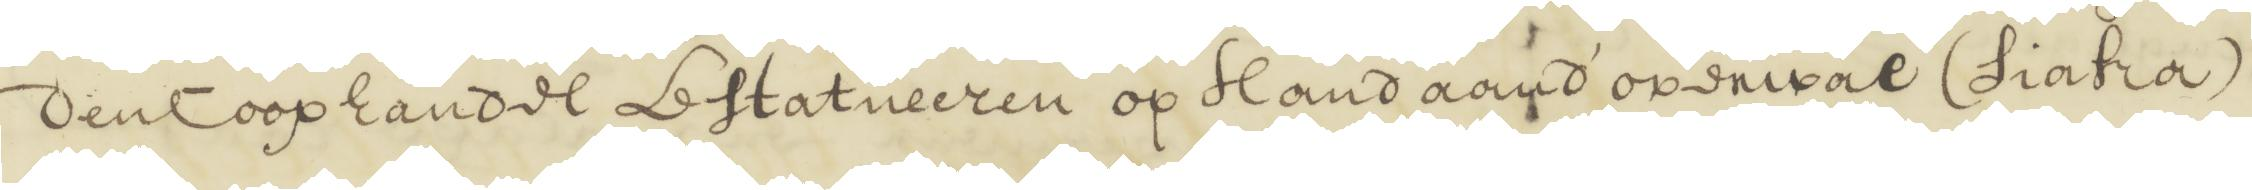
den Coophandel te statueeren op 't land aan d’ overwal (Siaka)
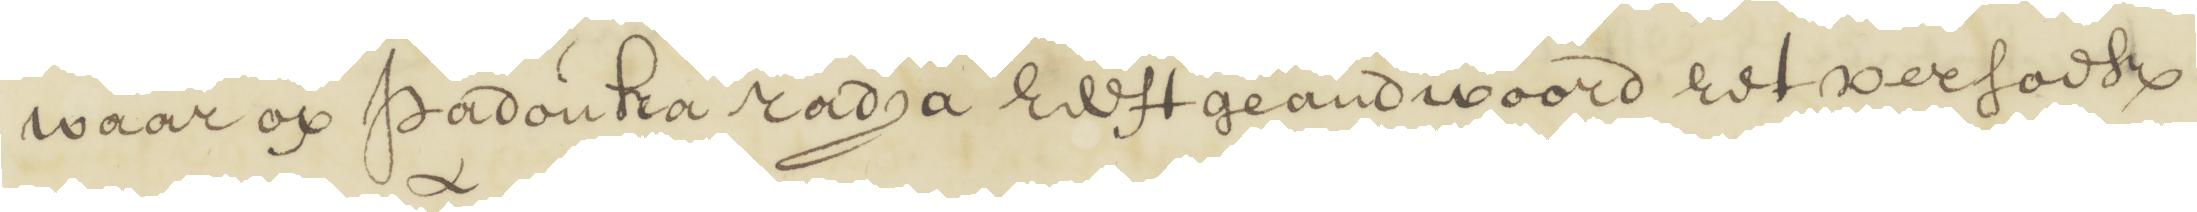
waar op Padouka radja heeft geandwoord het versoek
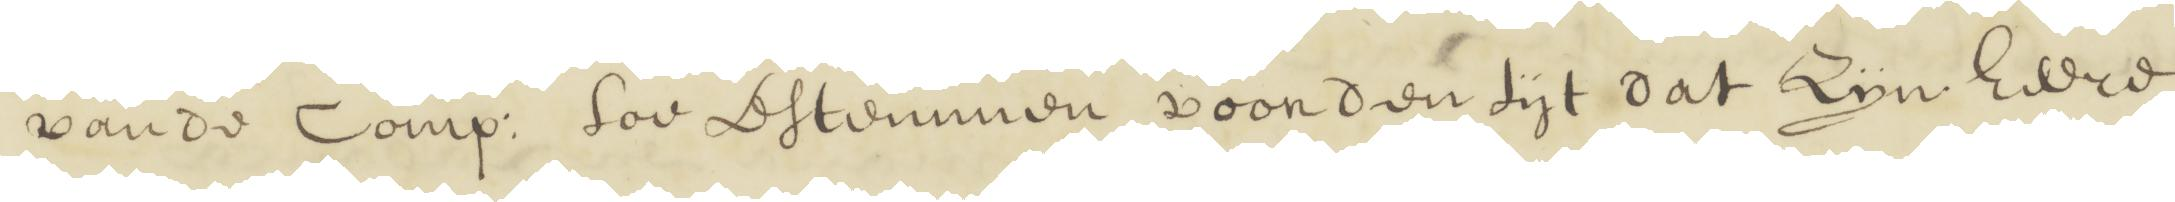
van de Comp: toe testemmen voor den tijt dat Zijn heere
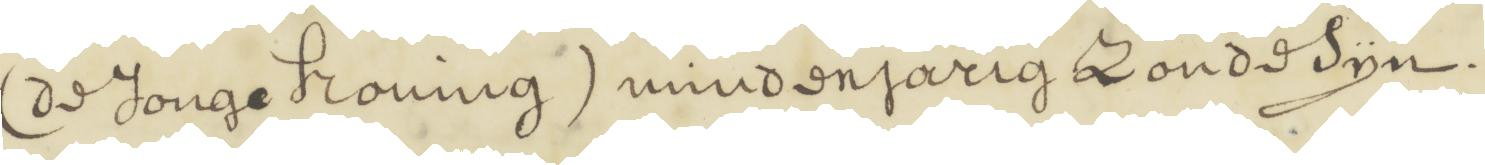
(de Ionge koning) minderjarig Zoude Sijn. —
